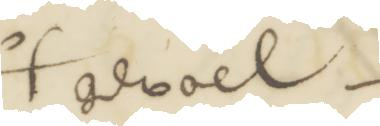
’t gevoel
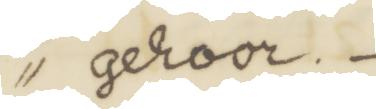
„ gehoor.
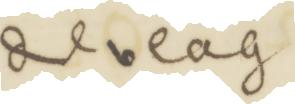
de vlag
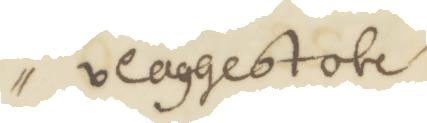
„ vlaggestok
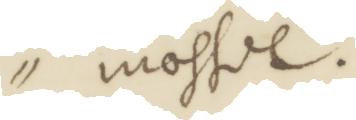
„ mossel.
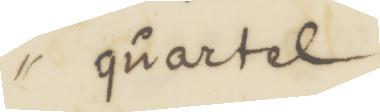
„ quartel
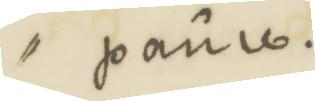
„ pauw.
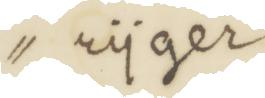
„ rijger
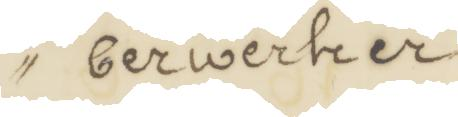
„ berwerker
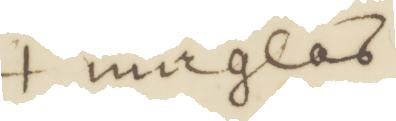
't uurglas
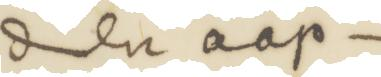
den aap
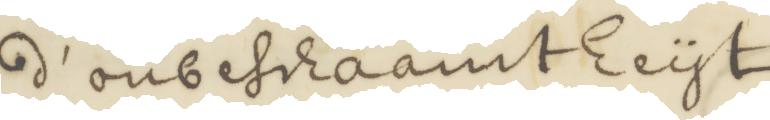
d’ onbeschaamtheijt
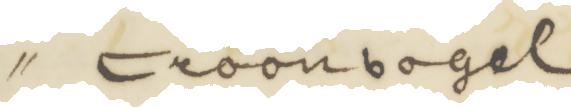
„ croonvogel
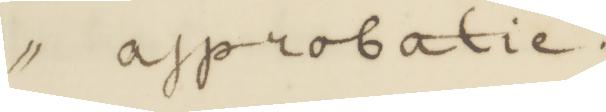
„ approbatie.
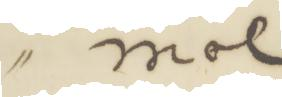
„ mol
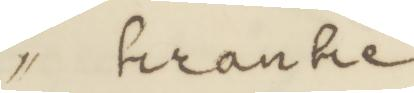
„ kranke
